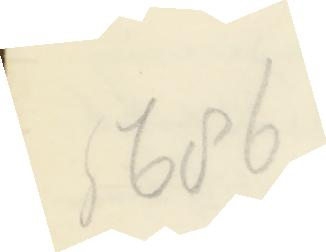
5686
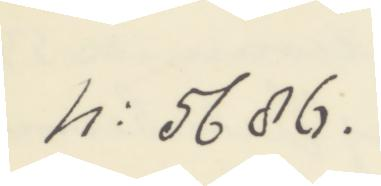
n: 5686.
